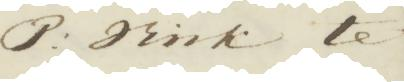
P: Vink te
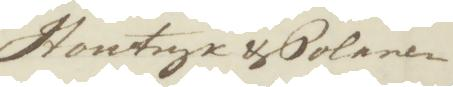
Houtryk & Polanen
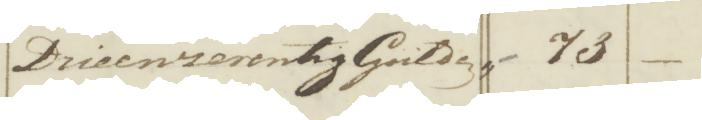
Drieénzeventig Gulden „- 73 —
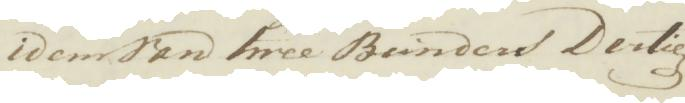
idem van twee Bunders Dertien
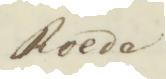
Roede
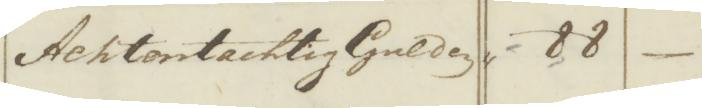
Achtentachtig Gulden „- 88 —
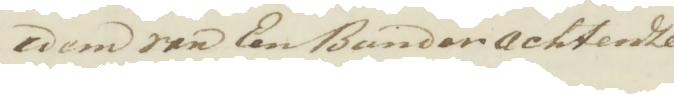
idem van Een Bunder achtenze
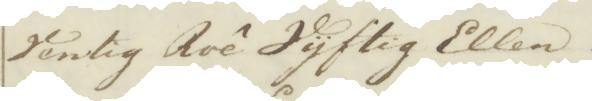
Ventig Roê Vijftig Ellen
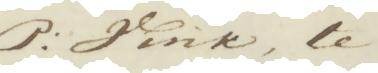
P: Vink, te
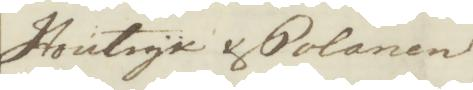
Houtrijk & Polanen
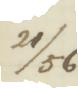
21/56
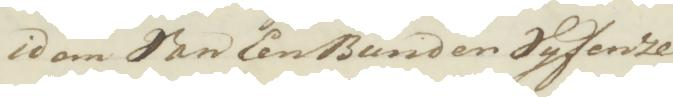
idem Van Een Bunder Vyfenze
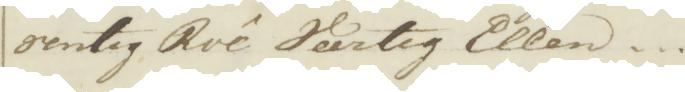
ventig Roê Veertig Ellen...
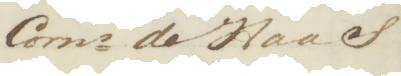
Corn=s de Haas
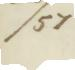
22/57
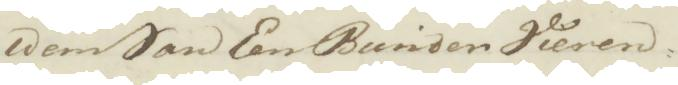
idem Van Een Bunder Vieren:
